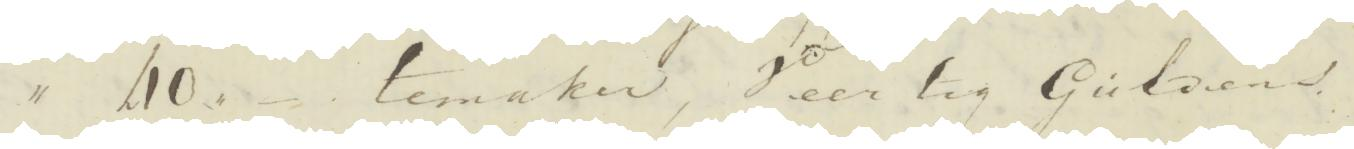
„ 40„ -. temaker, Veertig Guldens.
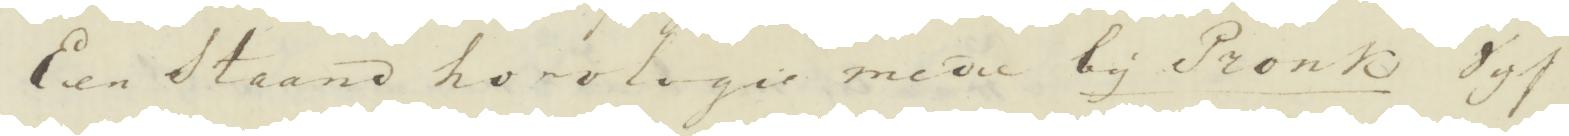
Een staand horologie mede bij Pronk Vyf
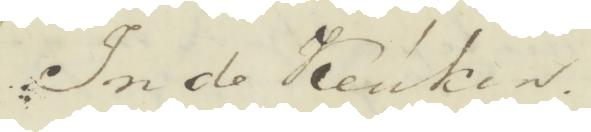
In de Keuken.
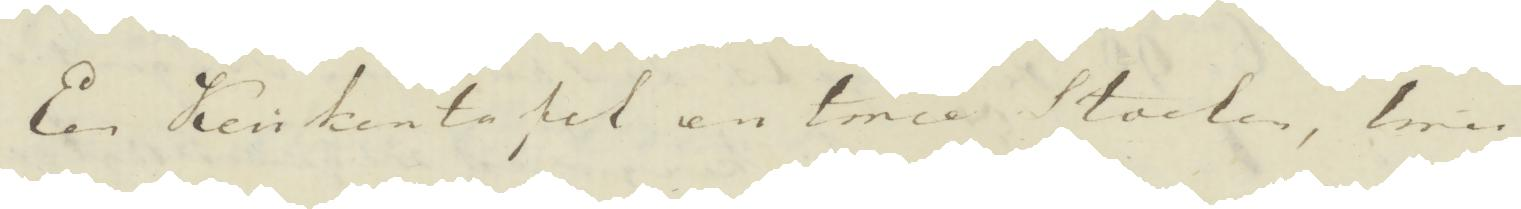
Een Keukentafel en twee Stoelen, twee
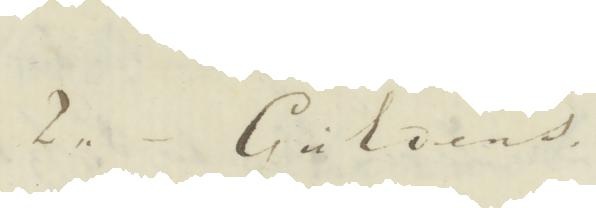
2„ — Guldens.
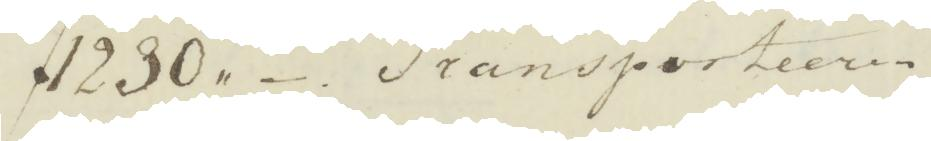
ƒ1230„ —. Transporteeren
